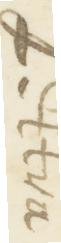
Lettra
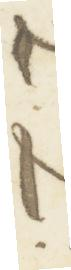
L: L:
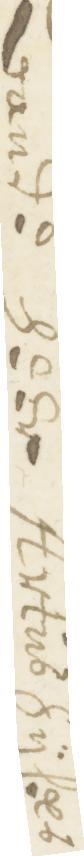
vande heer Artus gijsels
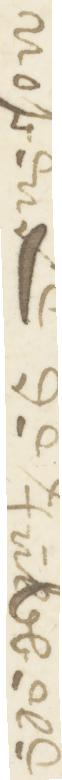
nopende de Juwele
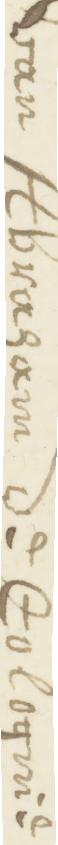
van Abraham de Colognie
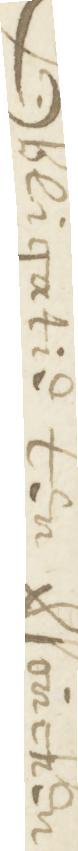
Obligatie ten versoucken
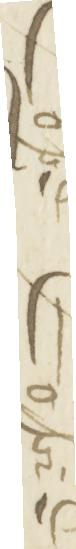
Cope Copie
